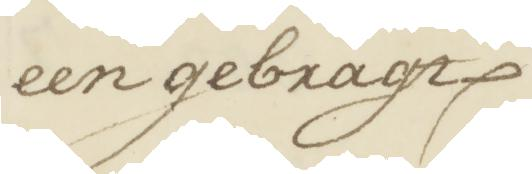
een gebragt
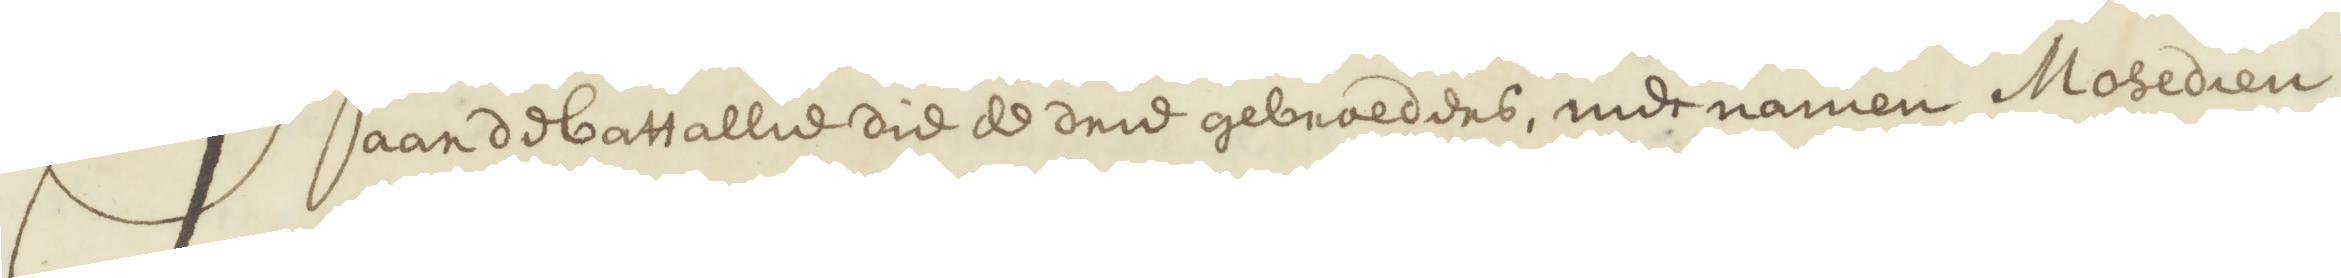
Naar de battallie die de drie gebroeders, met namen Mosedien
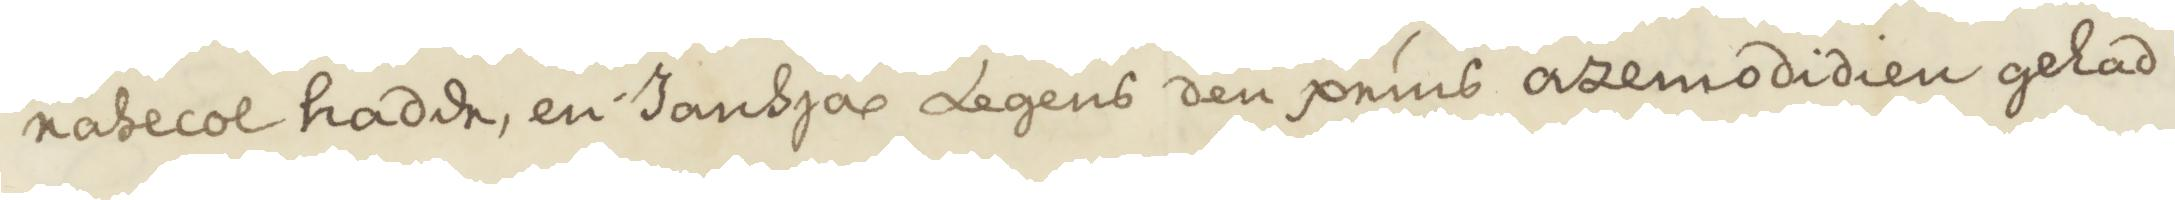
rasecol hader, en Iansja tegens den prins azemodidien gehad
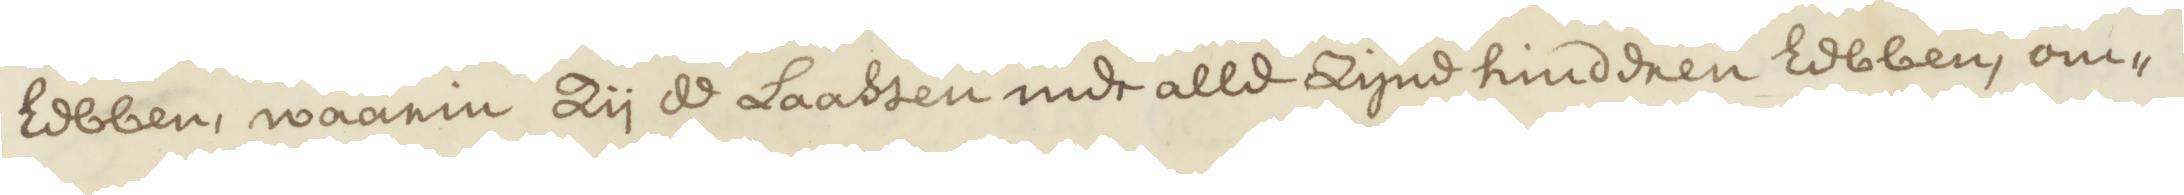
hebben, waarin zij de laasten met alle zijne kinderen hebben, om„
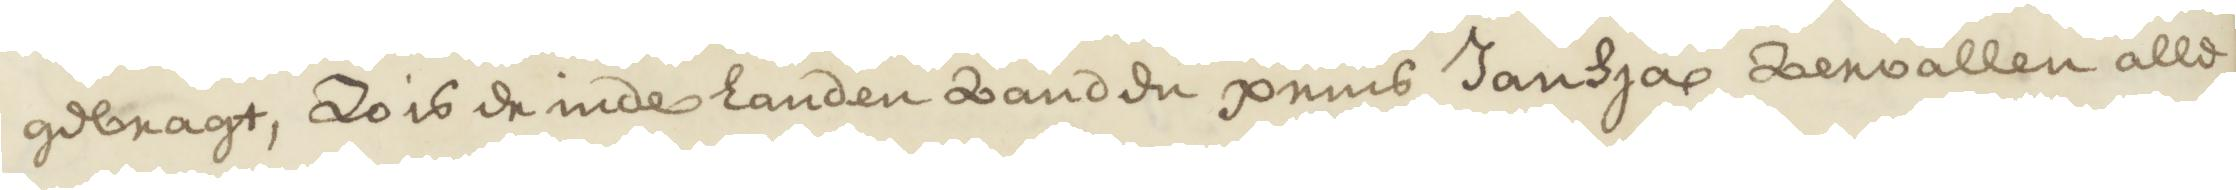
gebragt, zo is er inde handen van den prins Iansja vervallen alle
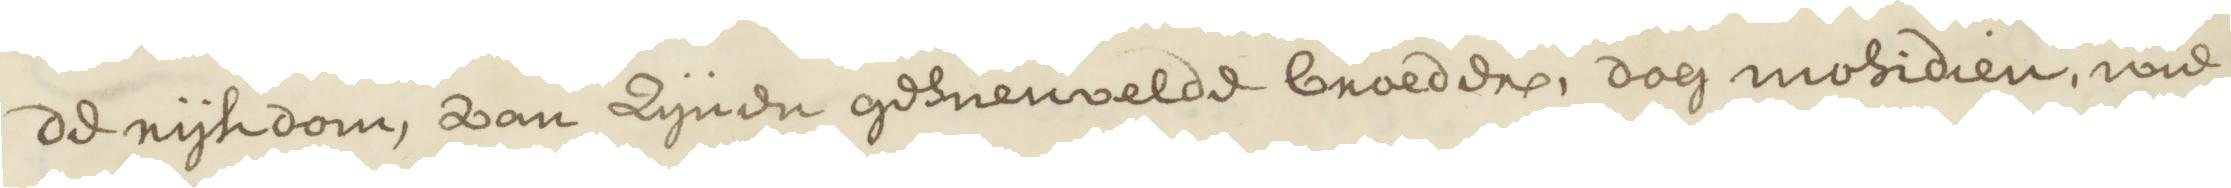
de rijkdom, van zijnen gesneuvelde broeder, dog mohidien, wie
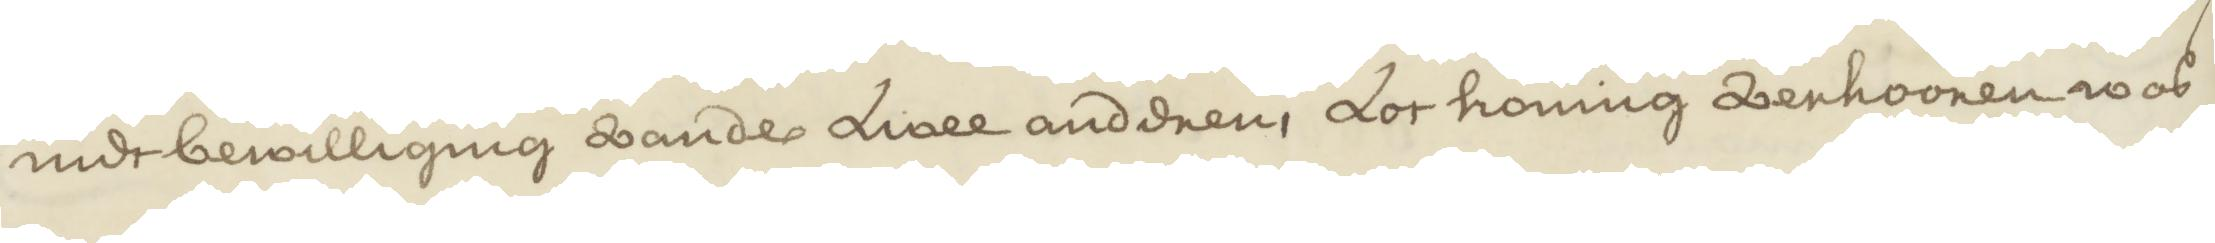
met bewilliging vande twee anderen, tot koning verkooren was
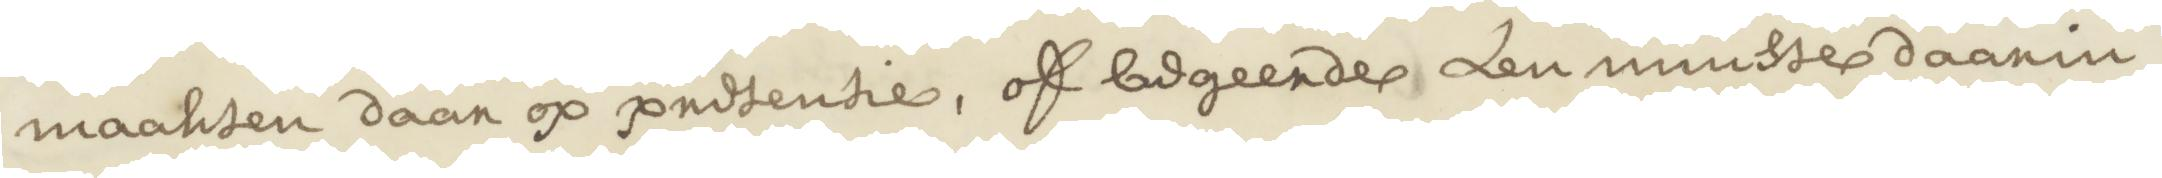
maakten daar op pretentie, of begeerde ten minste daarin
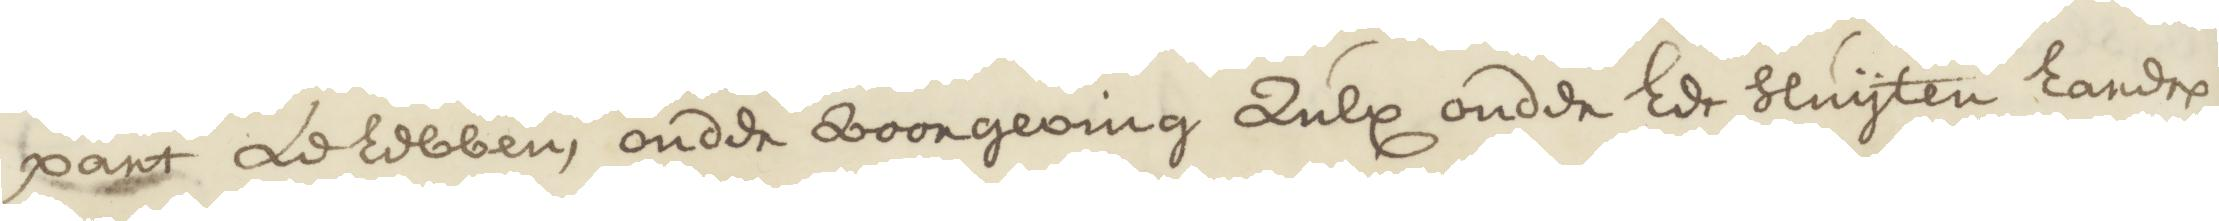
part te hebben, onder voorgeving zulx onder het sluijten harer
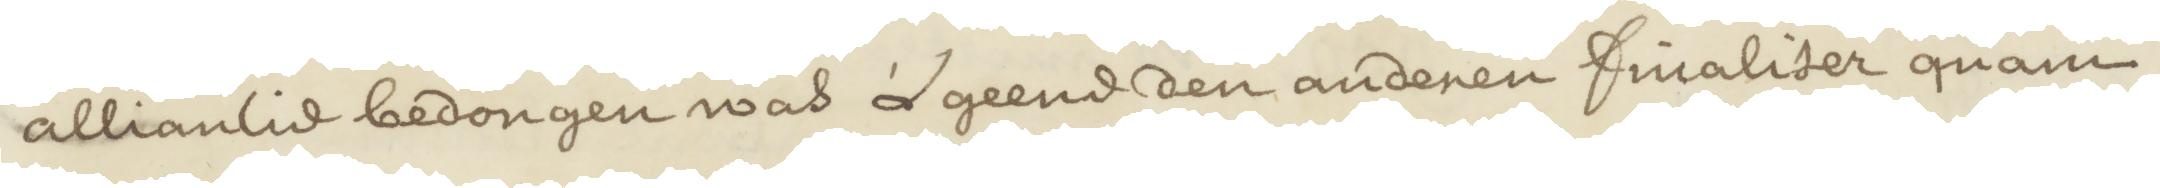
alliantie bedongen was 't geene den anderen finaliter quam
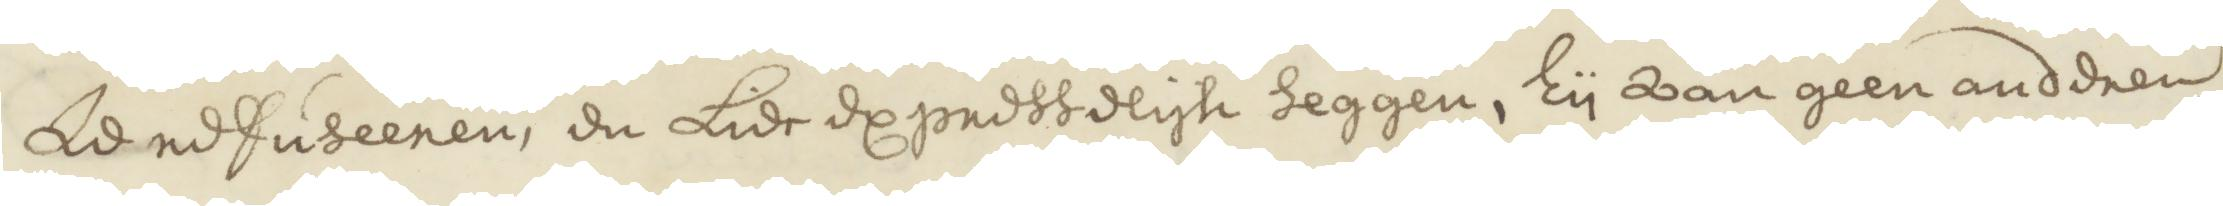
te refuseeren, en liet expresselijk seggen, hij van geen anderen
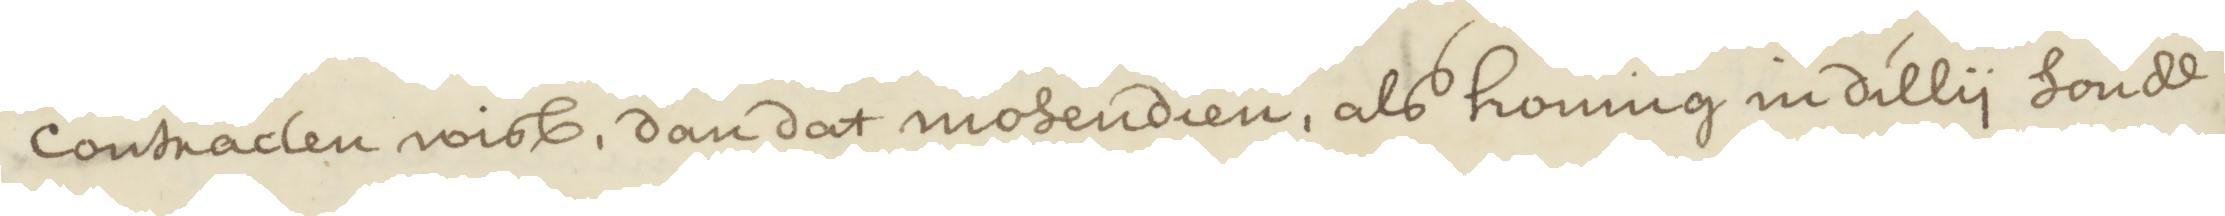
contracten wist, dan dat mohendien, als koning in dillij soude
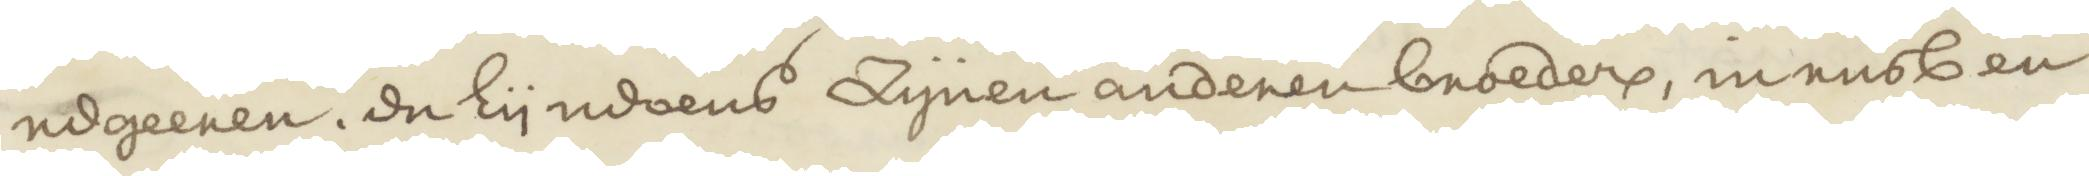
regeeren, en hij nevens zijnen anderen broeder, in rust en
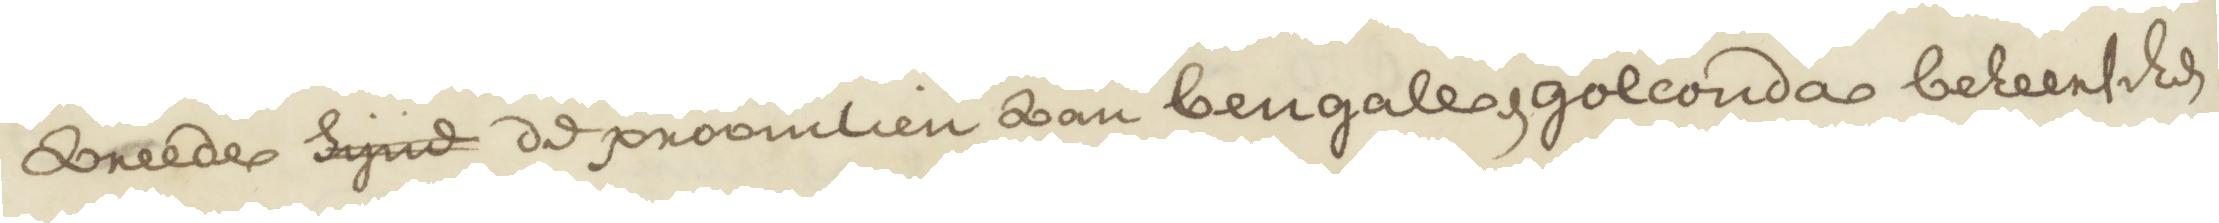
vreede sijne de provintien van bengale en golconda beheerschen
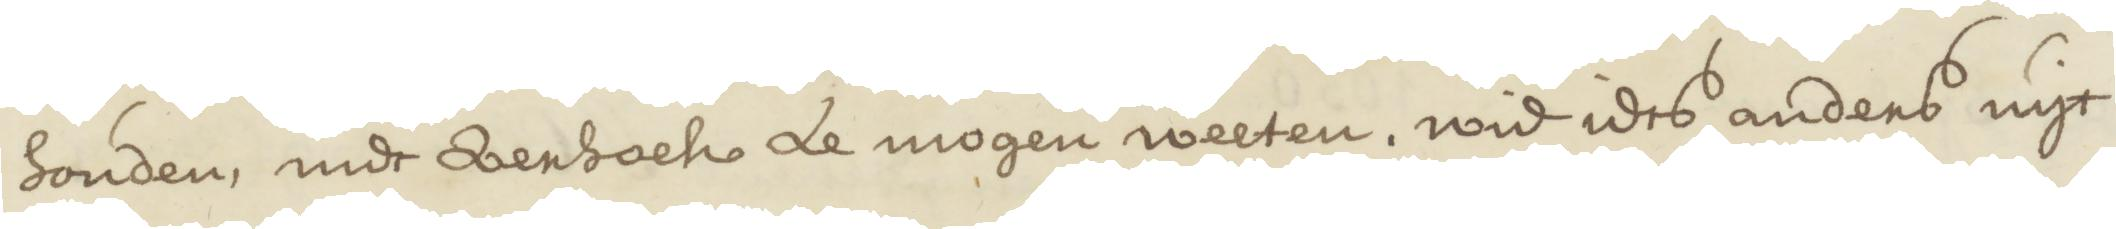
souden, met versoek te mogen weeten, wie iets anders uijt
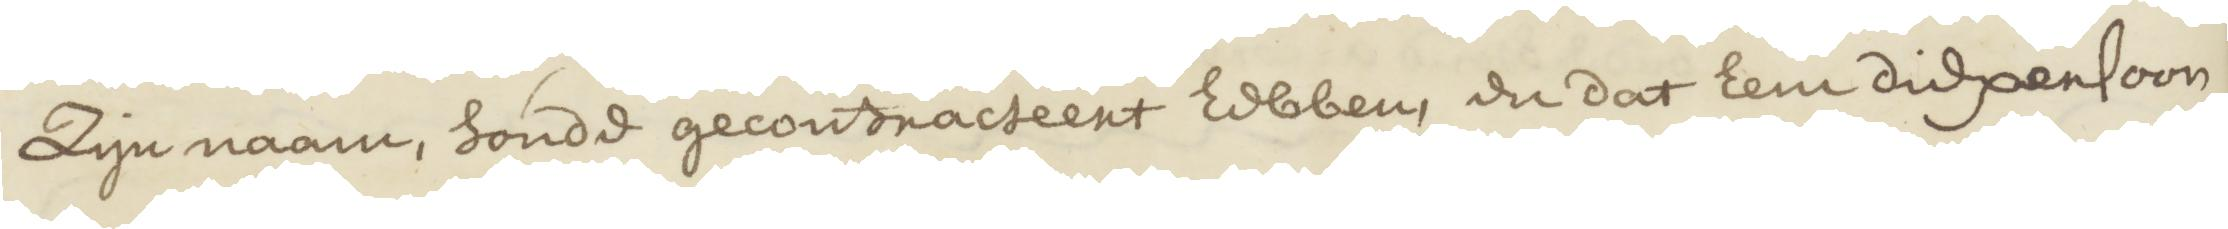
zijn naam, soude gecontracteert hebben, en dat hem diepersoon
